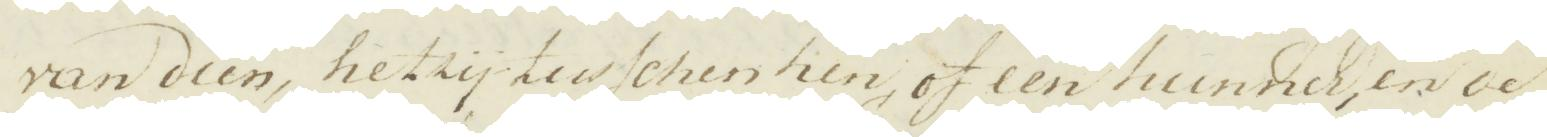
van dien, hetzij tusschen hen, of een hunner, en de
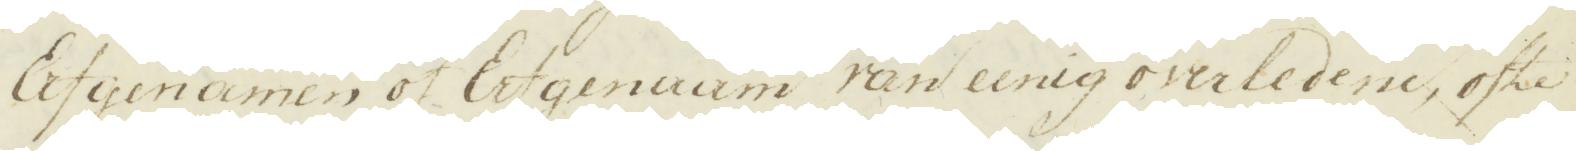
Erfgenamen of Erfgenaam van eenig overledene, ofte
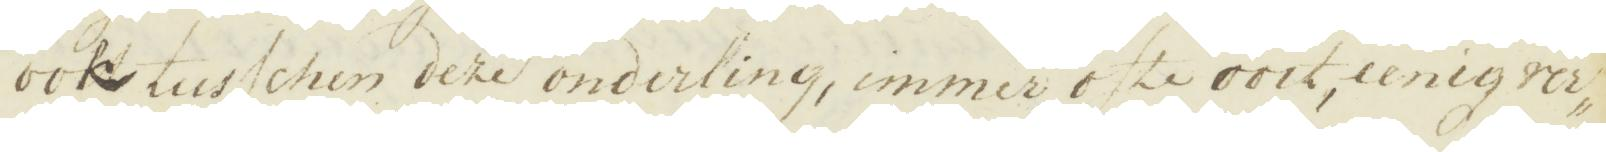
ook tusschen deze onderling, immer ofte ooit, eenig ver„
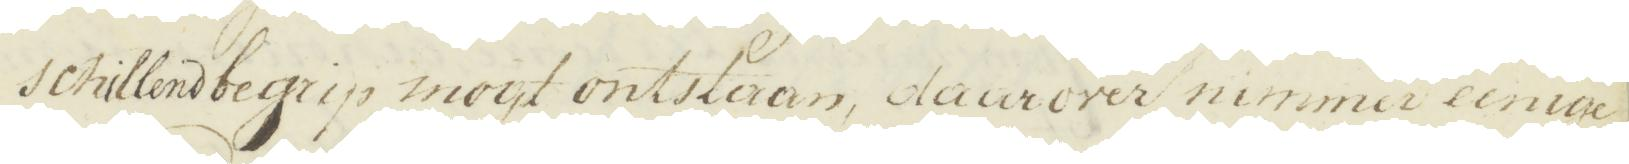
schillend begrip mogt ontstaan, daarover nimmer eenige
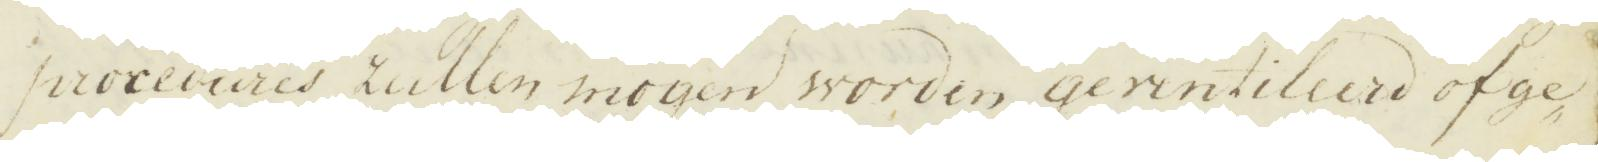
procedures zullen mogen worden geventileerd of ge„
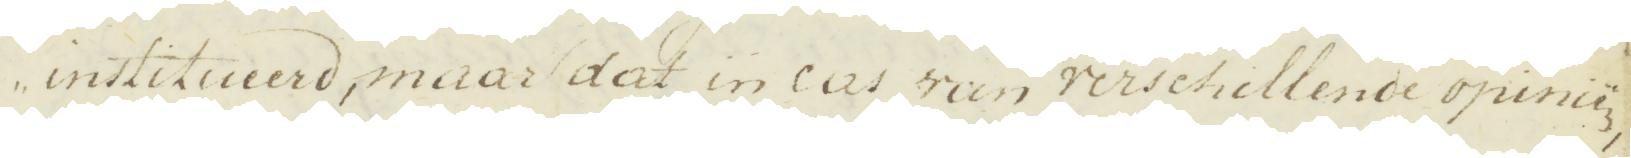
„ institueerd, maar dat in cas van verschillende opiniën,
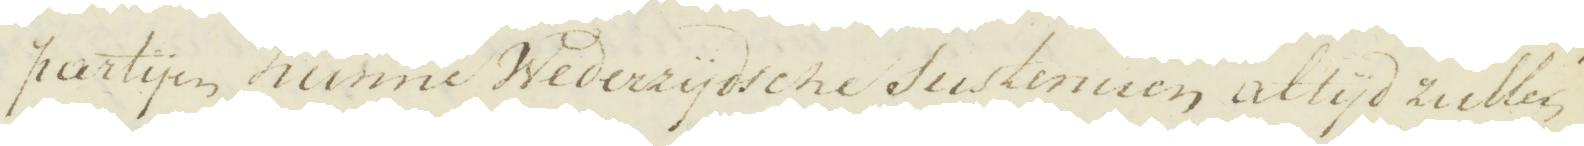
partijen hunne Wederzijdsche sustenuen altijd zullen
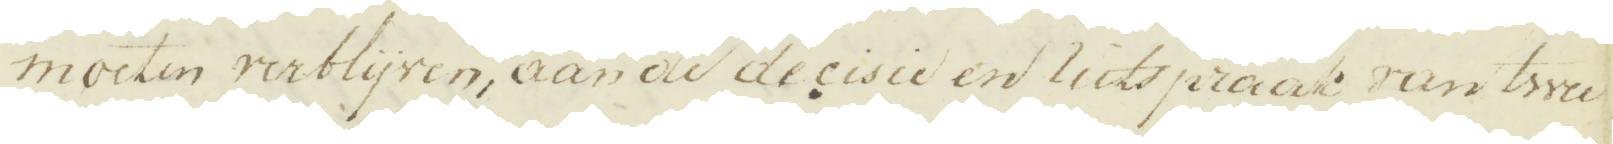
moeten verblijven, aan de decisie en Uitspraak van twee
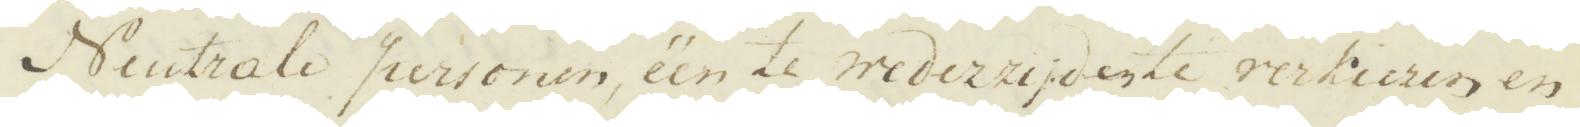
Neutrale personen, één te wederrzijden te verkiezen en
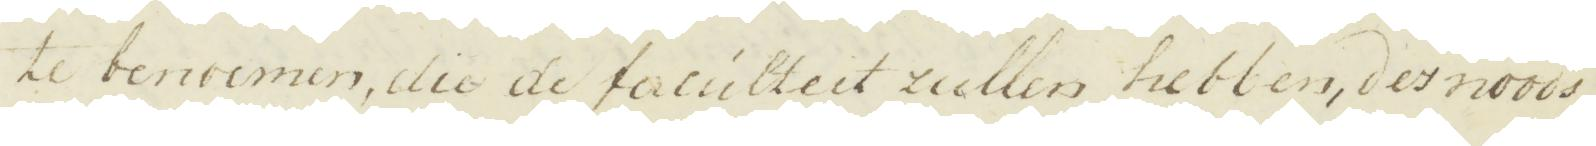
te benoemen, die de faculteit zullen hebben, des noods
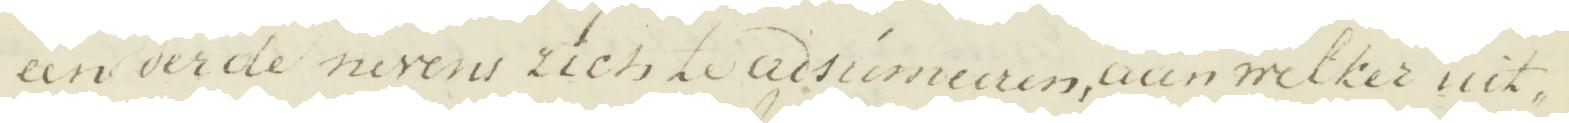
een derde nevens zich te adsumeeren, aan welker uit„
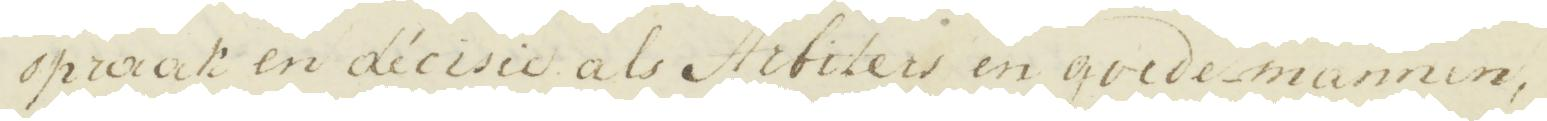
spraak en décisie als Arbiters en goede mannen,
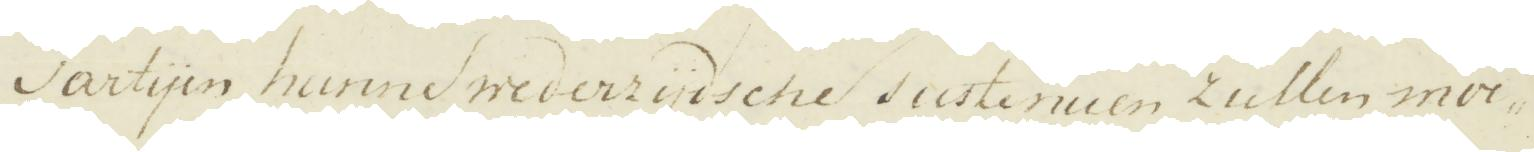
Partijen hunne wederzijdsche sustenuen zullen moe„
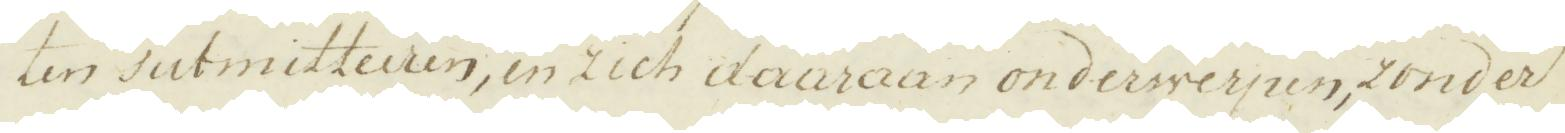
ten submitteeren, en zich daaraan onderwerpen, zonder
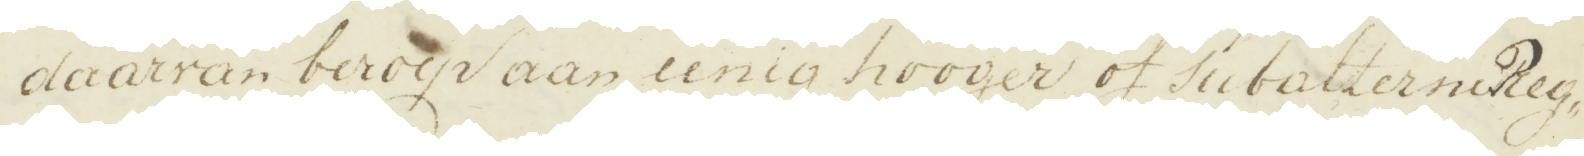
daarvan beroep aan eenig hooger of subalterne Reg
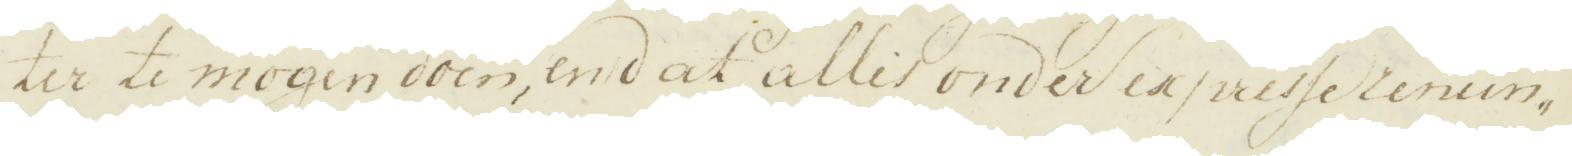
ter te mogen doen, en dat alles onder expresse renun„
